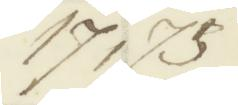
17,75
